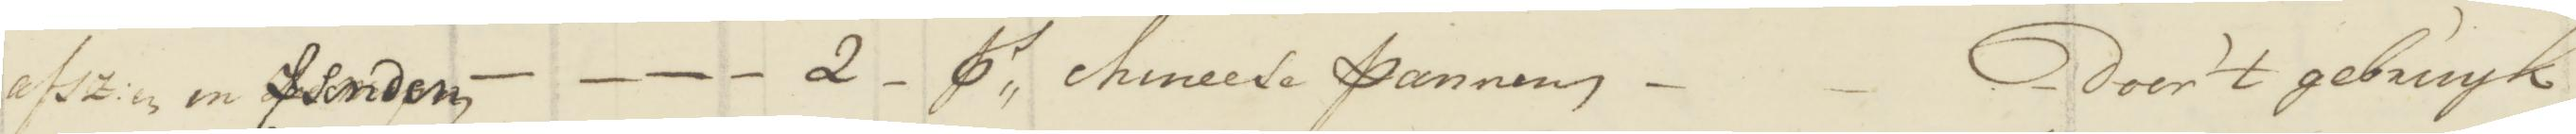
afsz:en en versenden — — — — 2 — p„s chineese pannen _ _ door ’t gebruyk
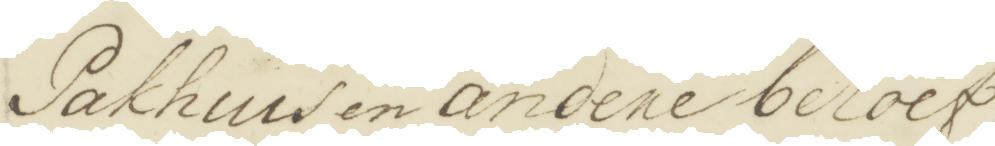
Pakhuis en andere behoef
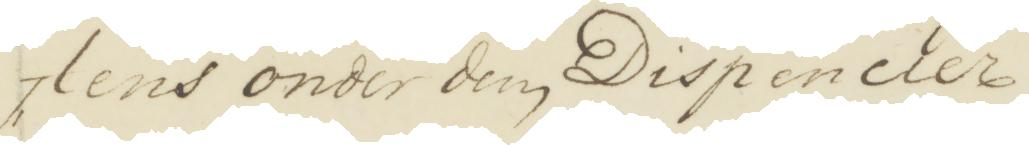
„tens onder den Dispencier
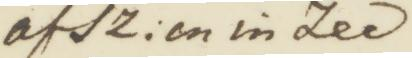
afsz: en in zee
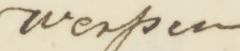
werpen
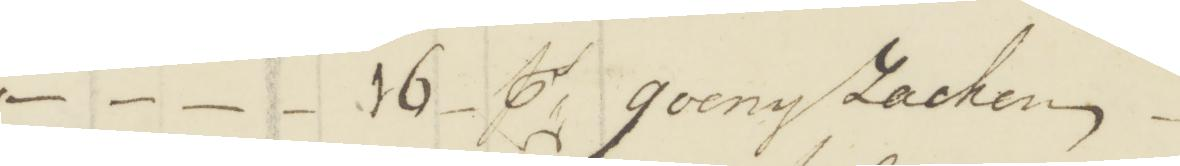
— — — — 16 — p„s goeny zacken
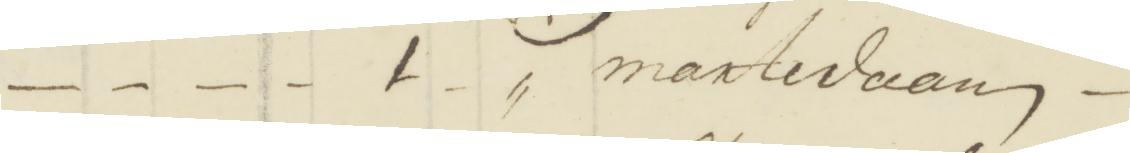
— — — — 1 — „ martevaan
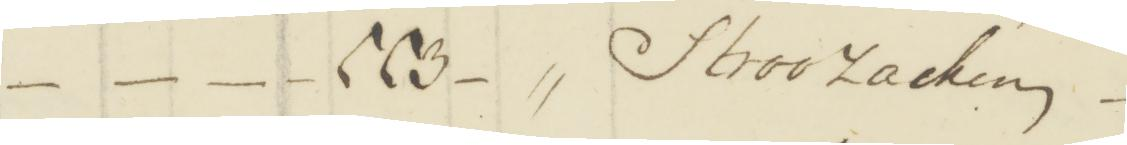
— — — — 553 — „ Stroozacken
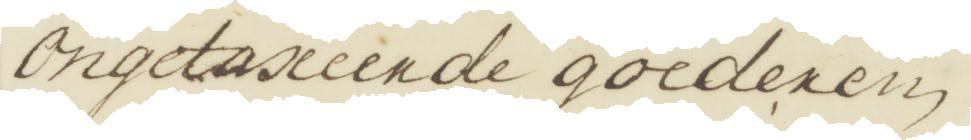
ongetaxeerde goederen
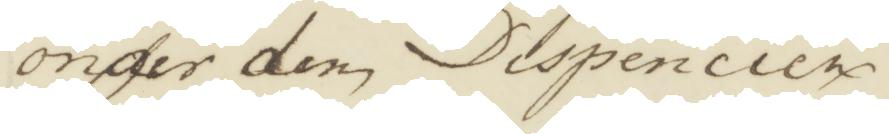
onder den Dispencier
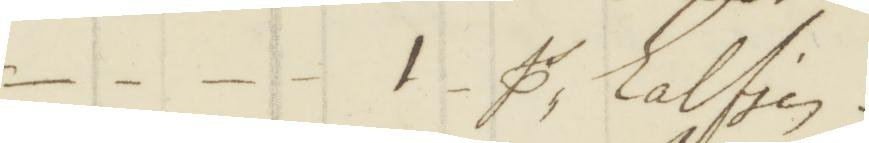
— — — — 1 — p„s halfje
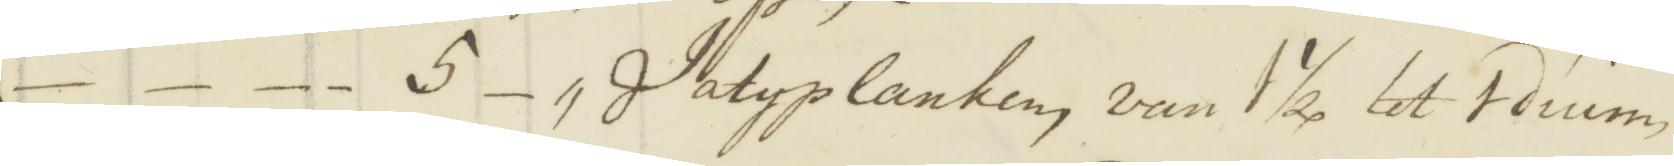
— — — — 5 — „ Jatyplanken van 1½ tot 1 duim
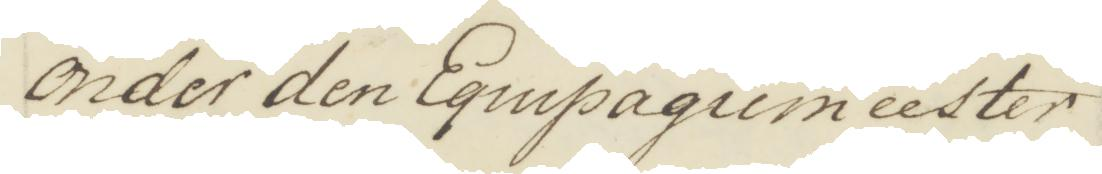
onder den Equipagiemeester
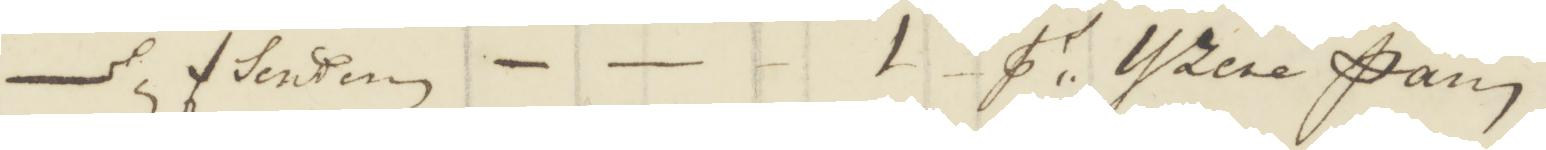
_:o en versenden — — — 1 — p„s yzere pan
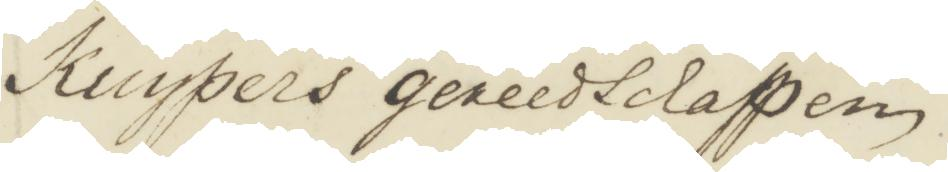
Kuypers gereedschappen
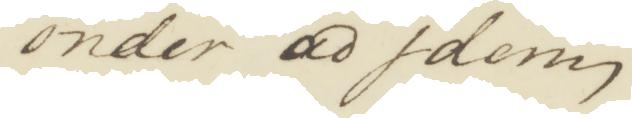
onder ad jdem
